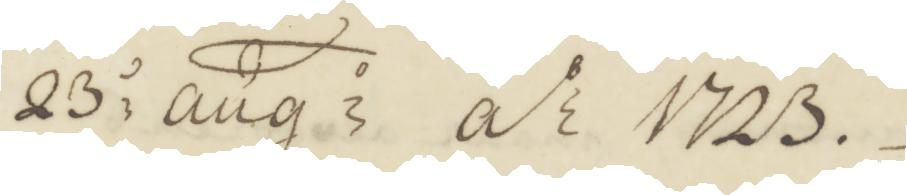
23:e aug=o a=o 1723. —
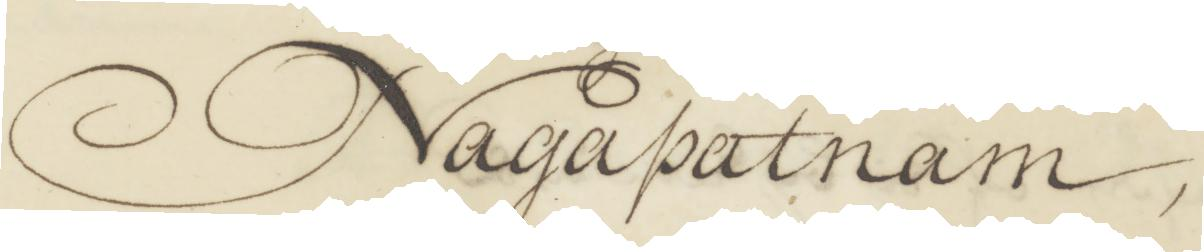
Nagapatnam,
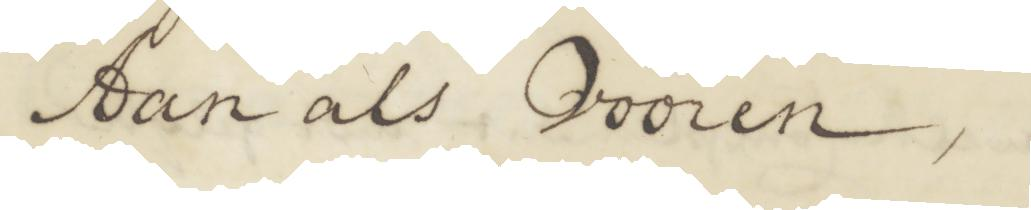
Aan als Vooren,
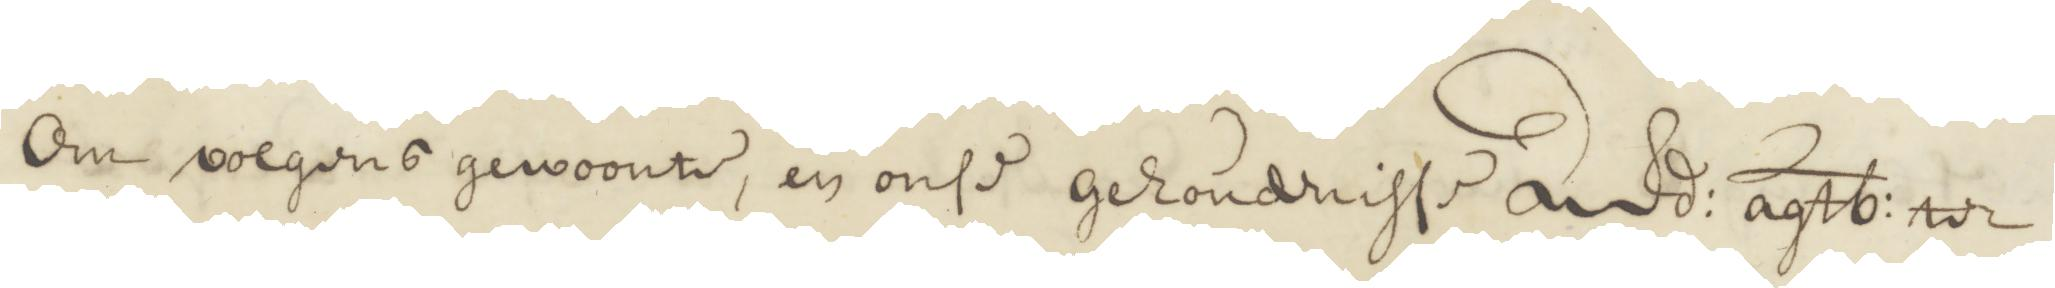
Om volgens gewoonte, en onse gehoudenisse u Ed: agtb: ter
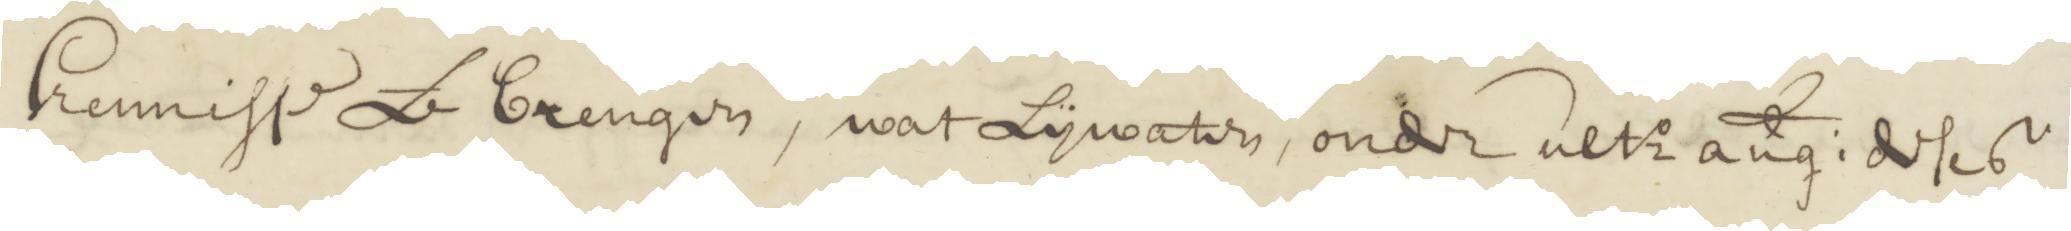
kennisse te brengen, wat Lijwaten, onder ult=o aug: deses
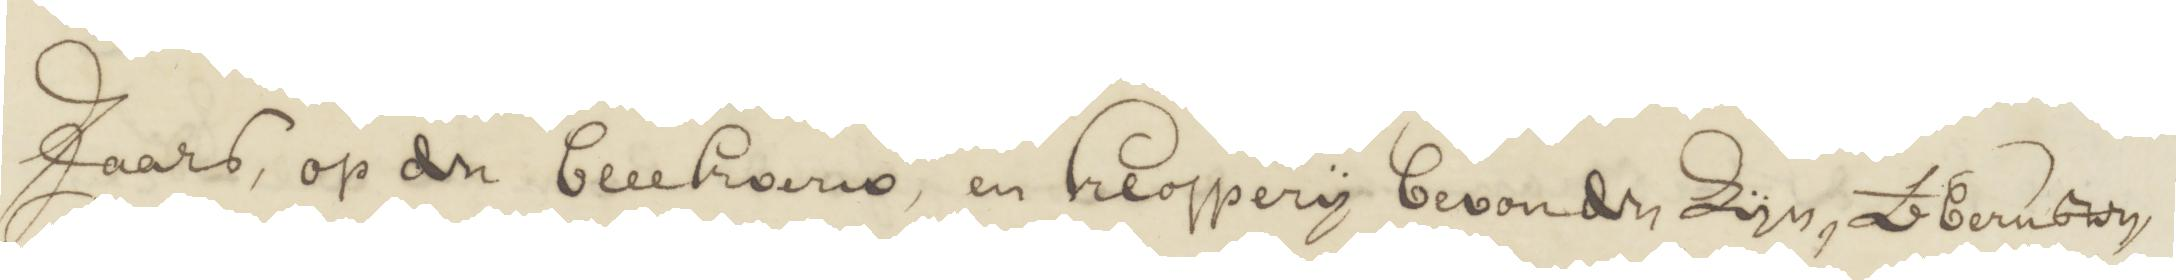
Jaars, op den bleekverw, en klopperij bevonden zijn, te berusten,
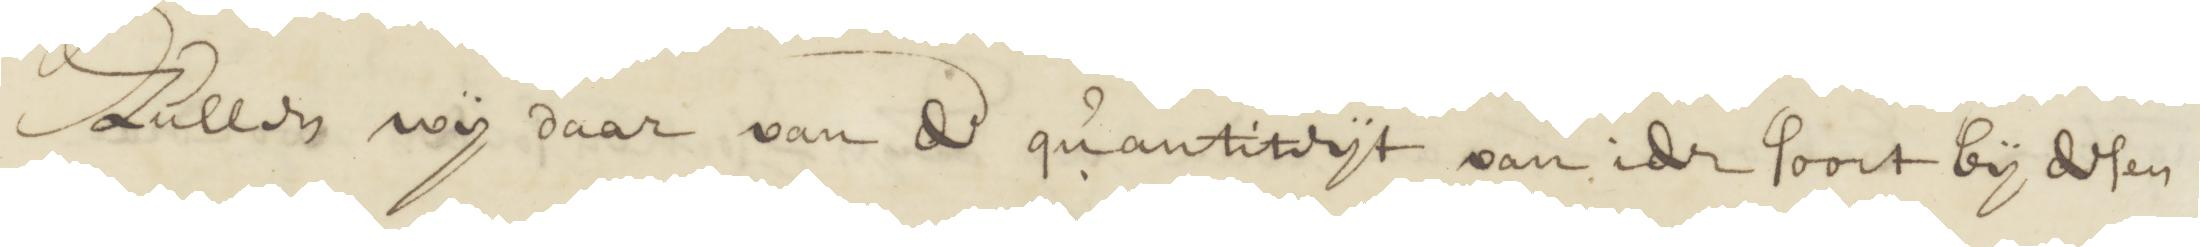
zullen wij daar van de quantiteijt van ider soort bij desen
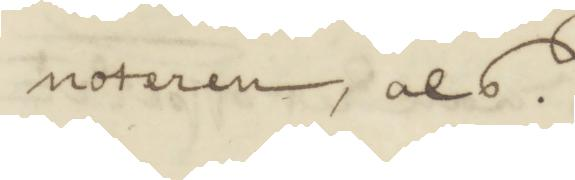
noteren, als.
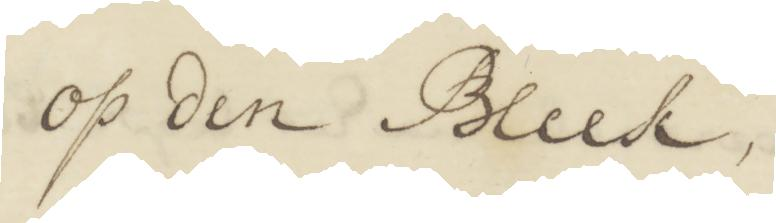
op den Bleek,
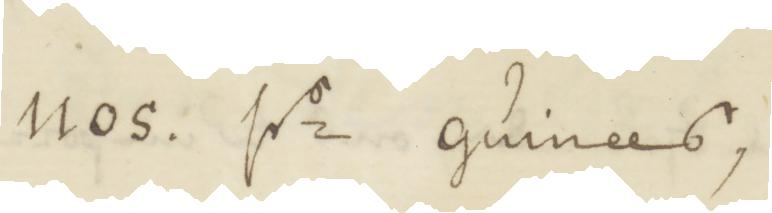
1105. p=s guinees,
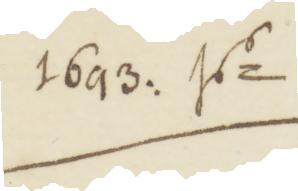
1643: p=s
